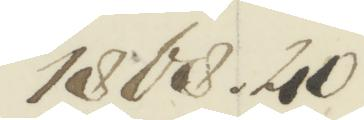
1868.40
